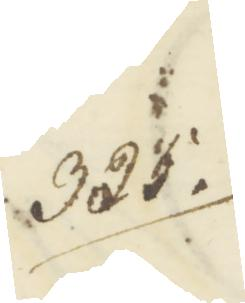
325.
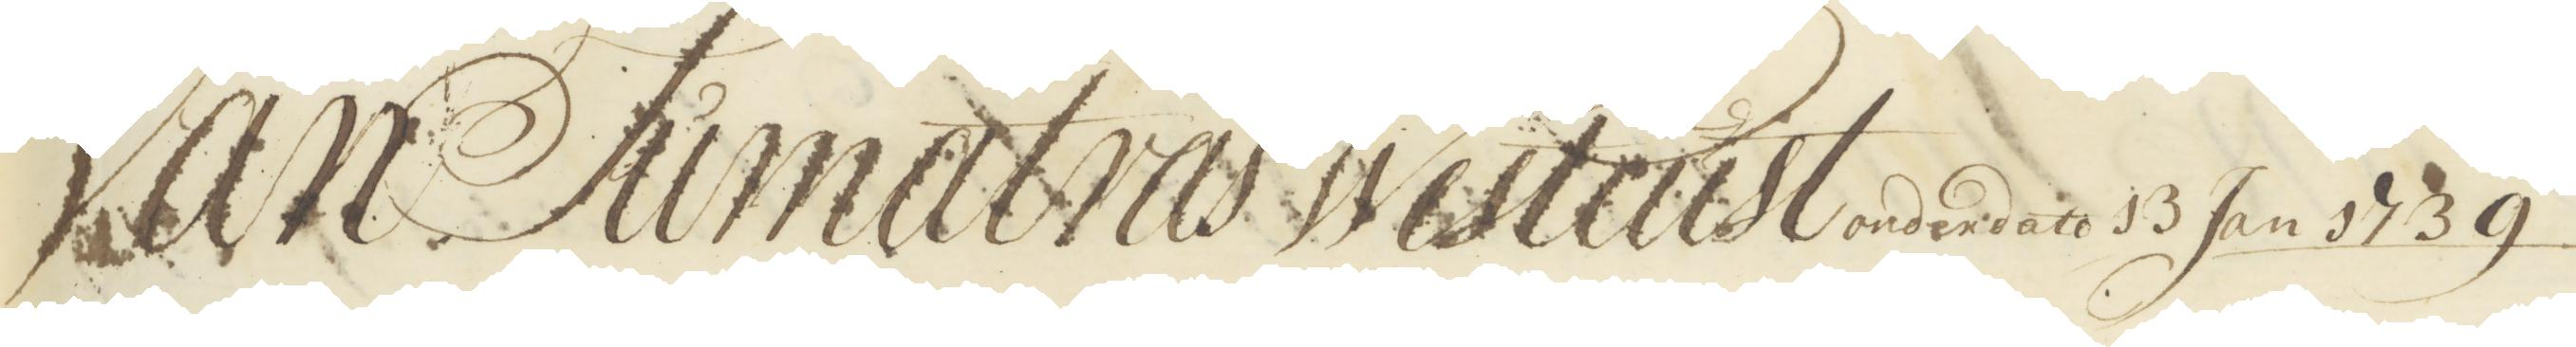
Van Sumatras westcust onder dato 13 Jan 1739
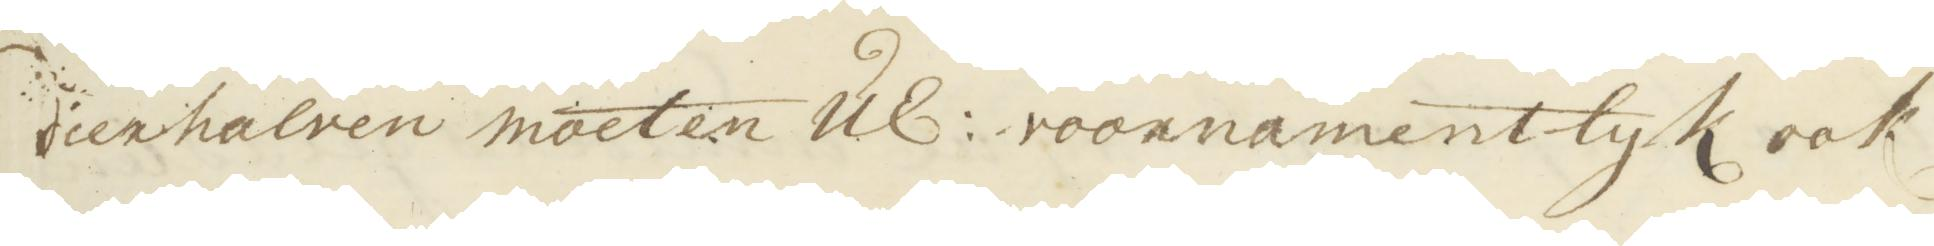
dierhalven moeten UE: voornamentlijk ook
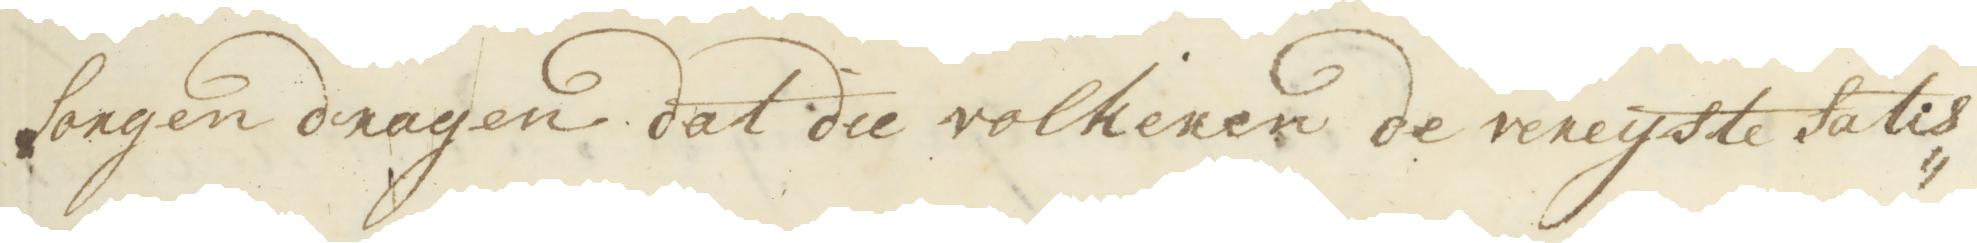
sorgen dragen dat die volkeren de vereijste satis„
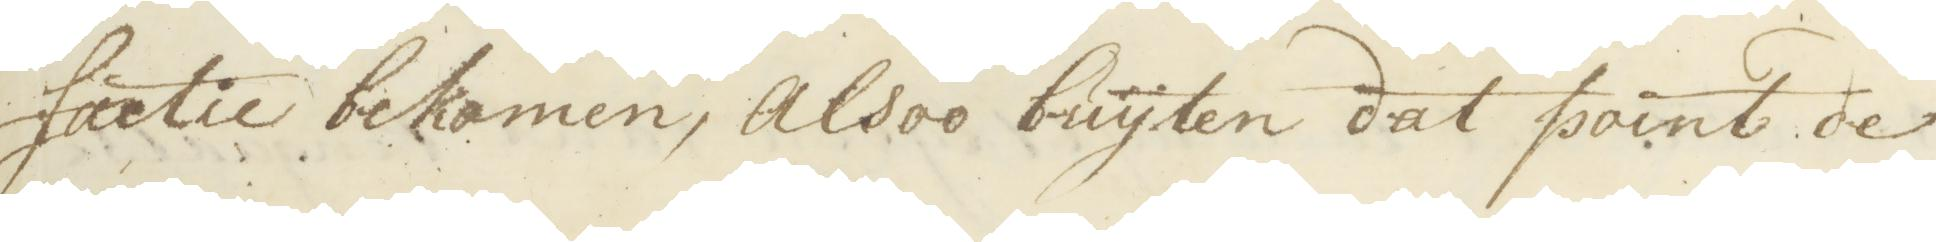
factie bekomen, alsoo buijten dat point de
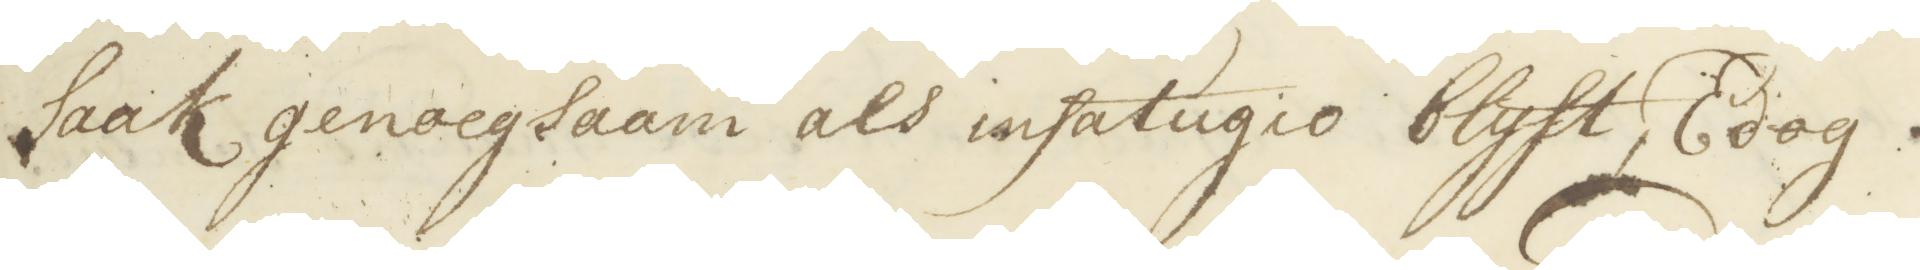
saak genoegsaam als infatugio blijft, Edog
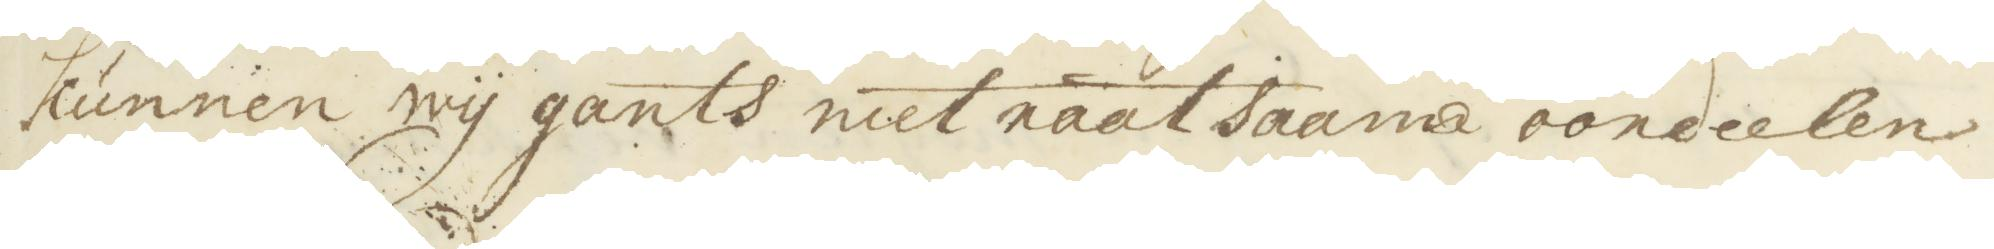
kunnen wij gants niet raatsaam oordeelen
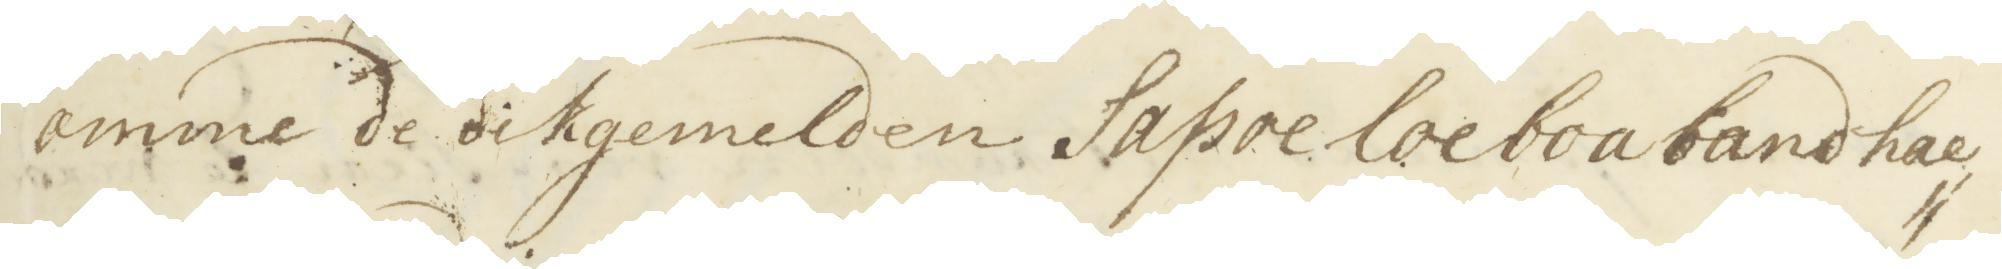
omme de dikgemelden Sapoe loeboa bandhae„
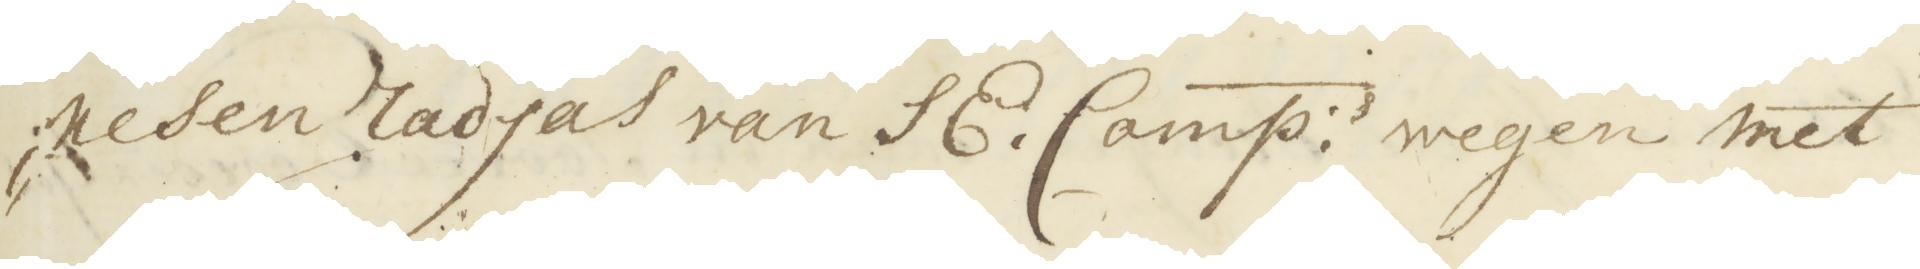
„resen radjas van sE: Comp:s wegen met
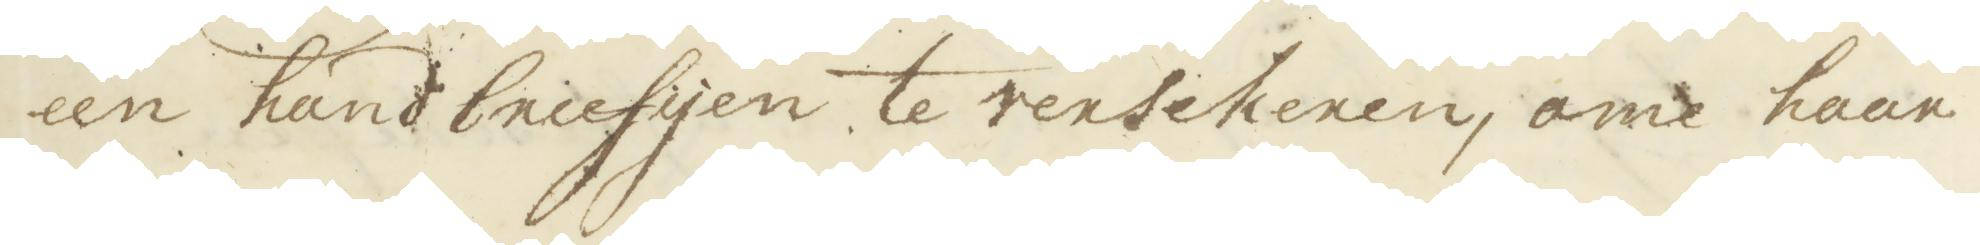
een hand briefijen te versekeren, om haar
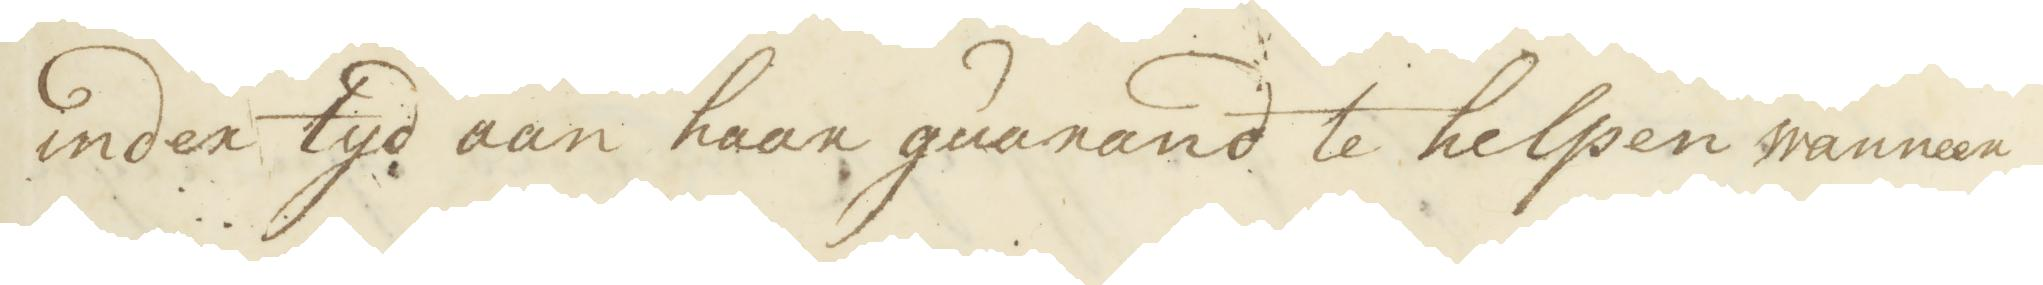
inder tijd aan haar guarand te helpen wanneer
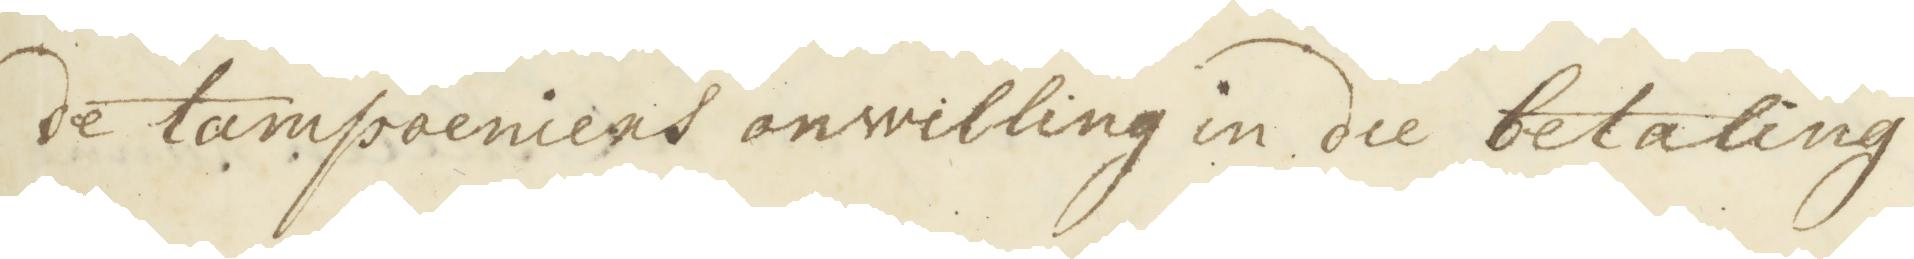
de tampoeniers onwilling in die betaling
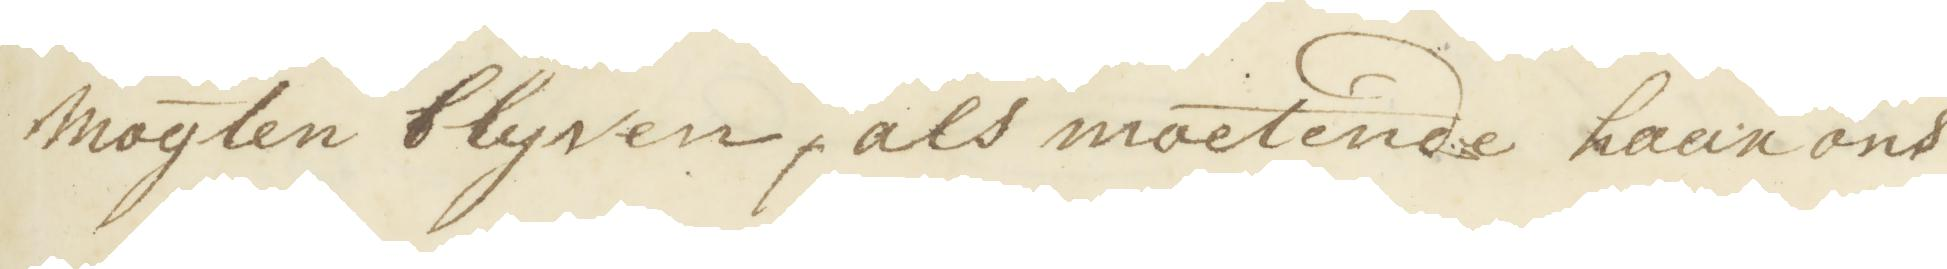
mogten blyven, als moetende haar ons
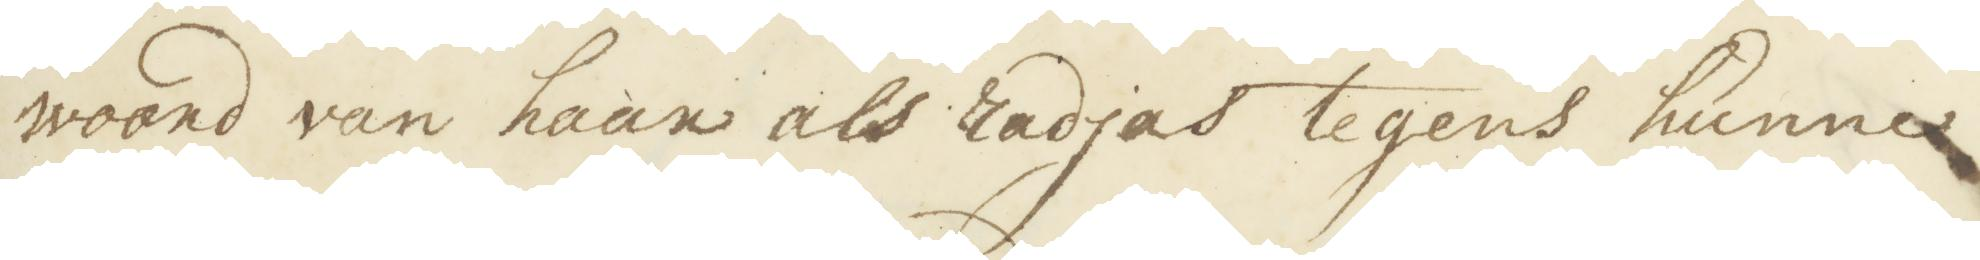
woord van haar als radjas tegens hunne
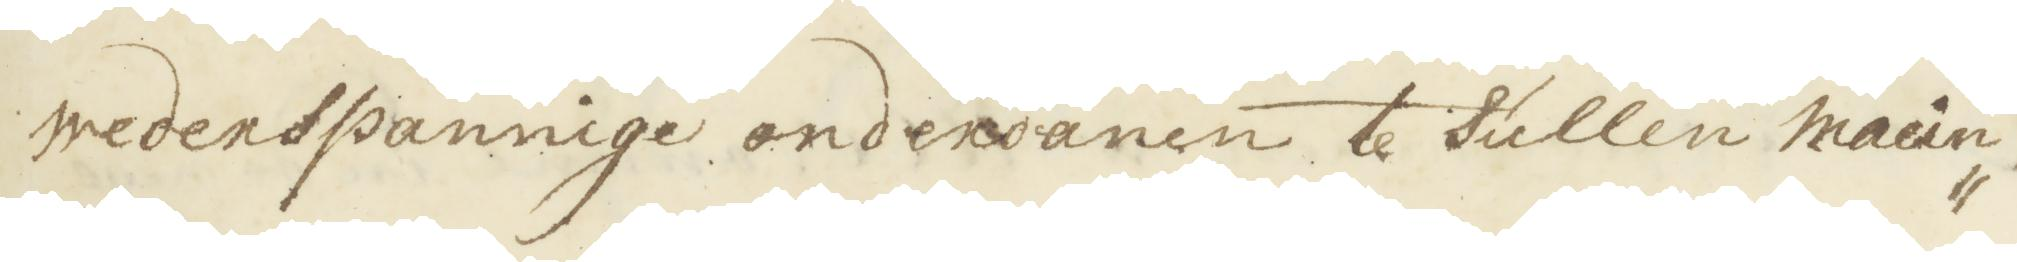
wederspannige onderdanen te sullen maein„
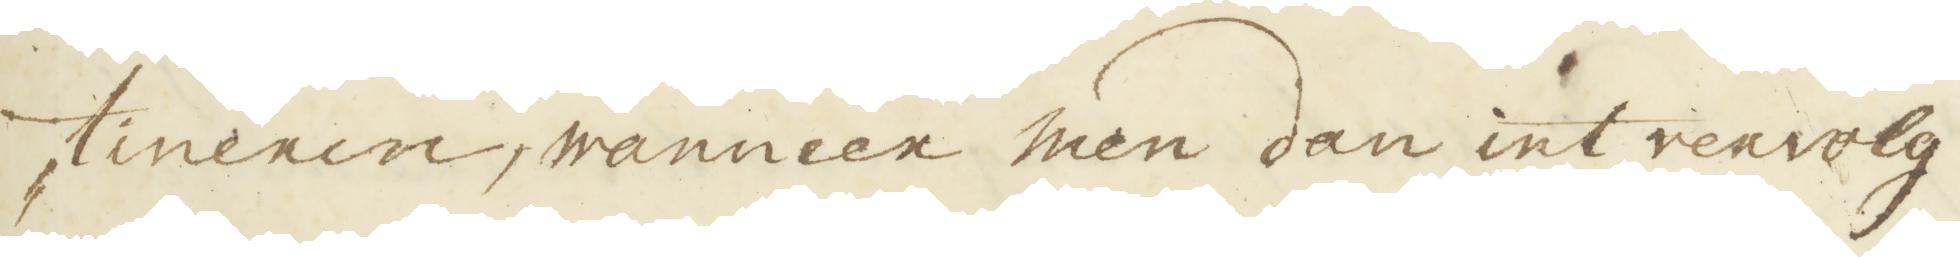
„tinerin, wanneer men dan in 't vervolg
